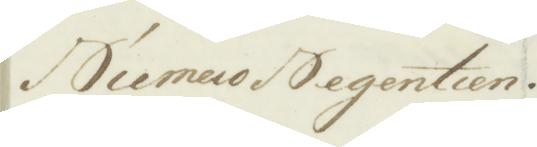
Numero Negentien.
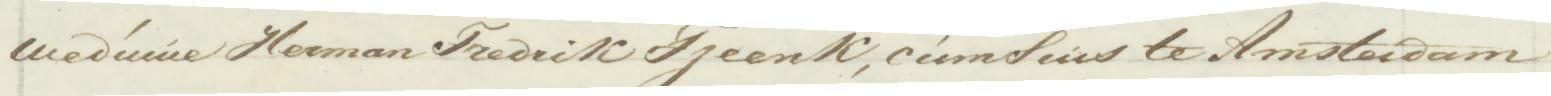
weduwe Herman Fredrik Tjeenk, cumsuis te Amsterdam
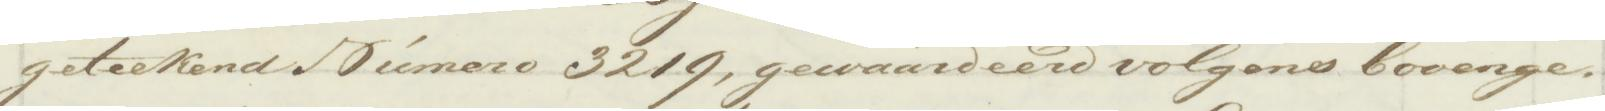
geteekend Numero 3219, gewaardeerd volgens bovenge„
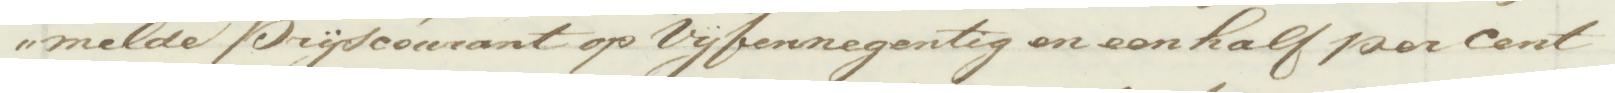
„melde Prijscourant op Vijfennegentig en een half per cent
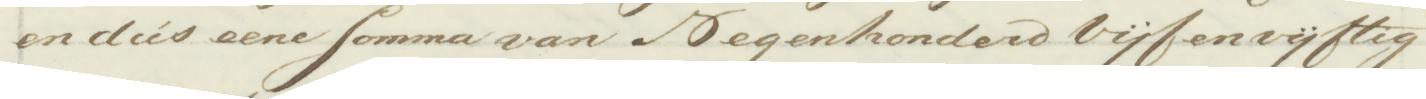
en dus eene somma van Negenhonderd Vijf en vijftig
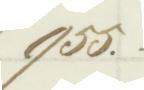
955.
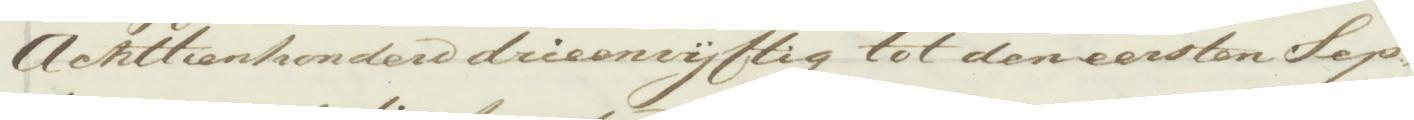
Achttienhonderd drieenvijftig tot den eersten Sep„
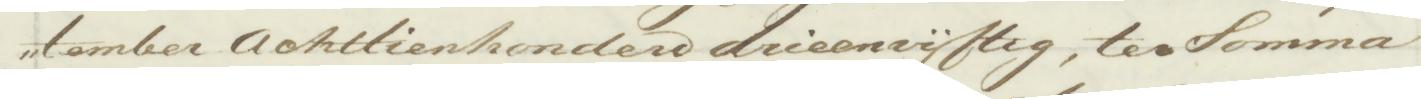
„tember Achttienhonderd drieen vijftig, ter Somma
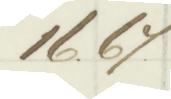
16. 67.
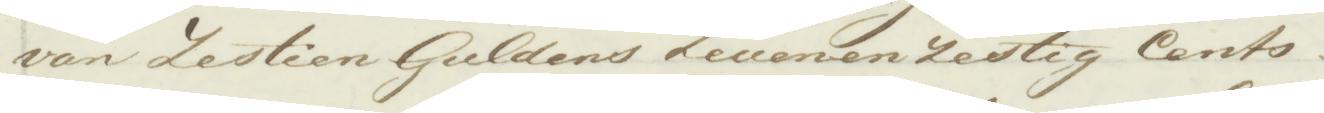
van Zestien Guldens Zeven en zestig Cents
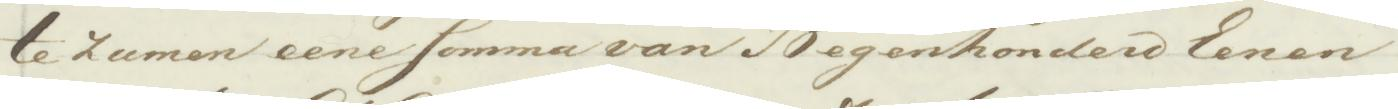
te zamen eene somma van Negenhonderd Eenen
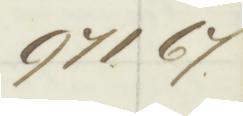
971.67.
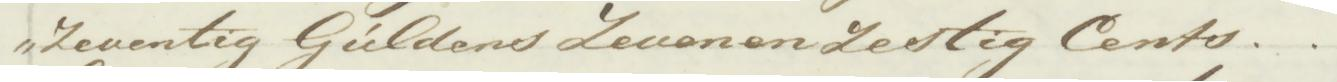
„zeventig Guldens Zeven en Zestig Cents . .
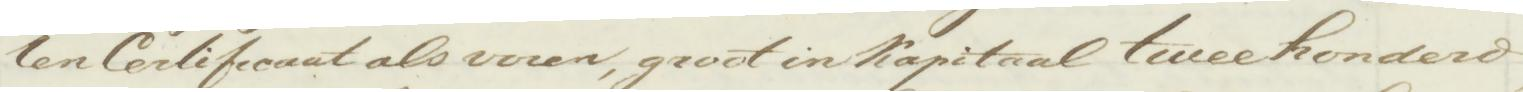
Een Certificaat als voren, groot in Kapitaal twee honderd
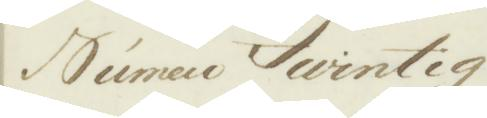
Numero Twintig
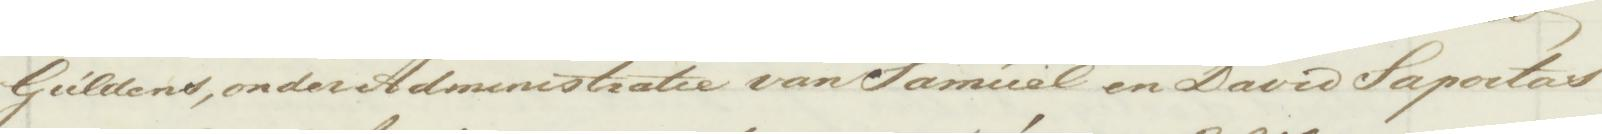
Guldens, onder Administratie van Samuel en David Saportas
